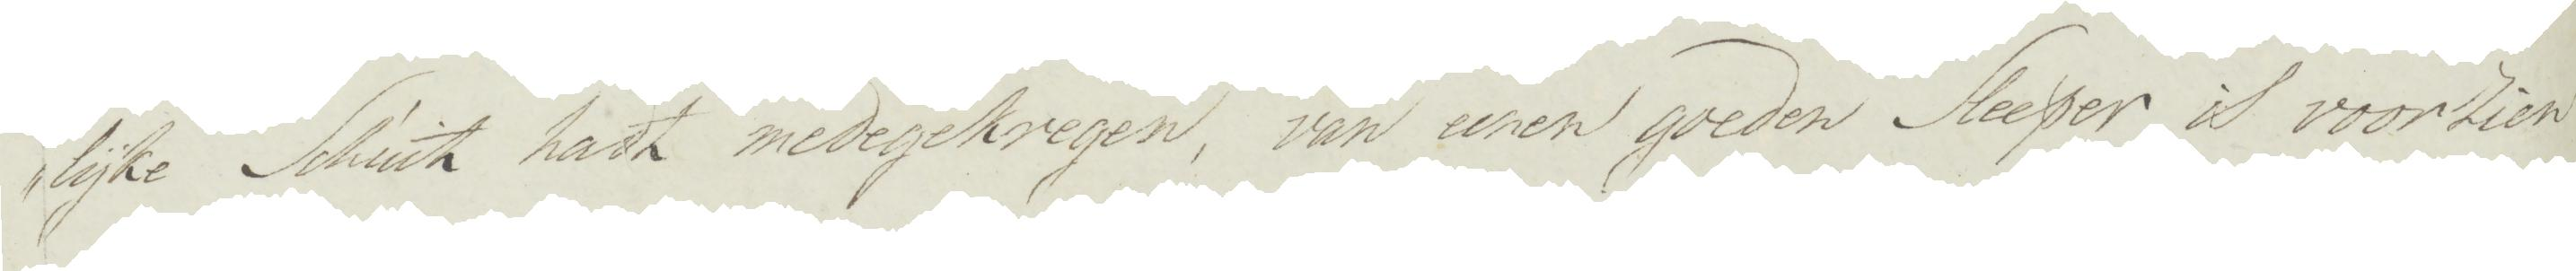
„lijke Schuit hadt medegekregen, van eenen goeden Sleeper is voorzien
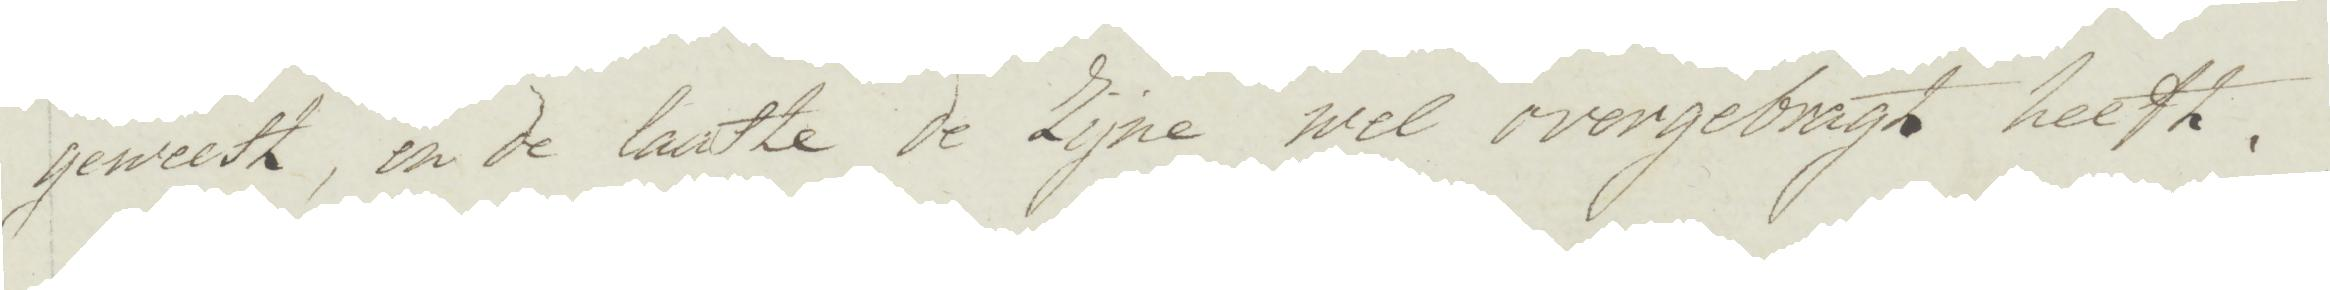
geweest, en de laaste de Zijne wel overgebragt heeft.
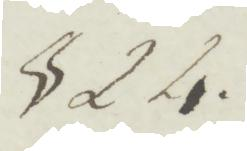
§ 24.
